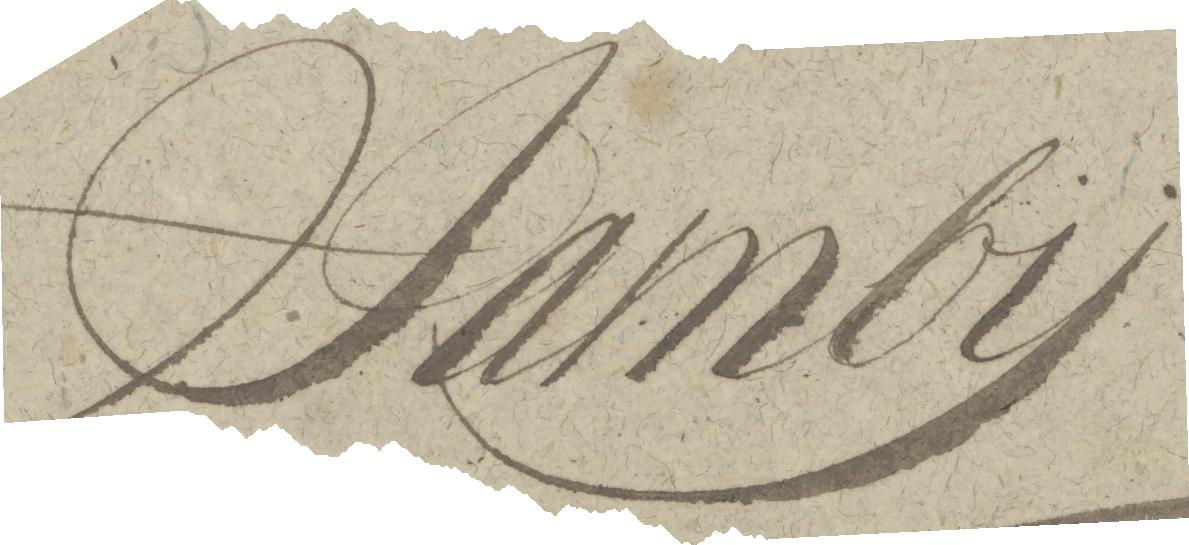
Iambij
